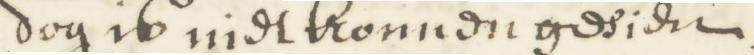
dog is niet konnen gesien
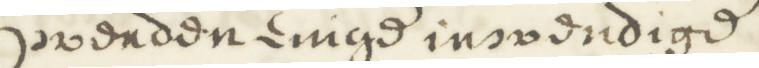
werden enige inwendige
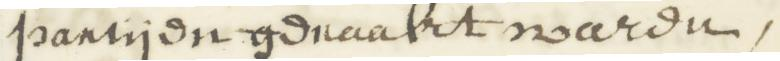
partijen geraakt waren,
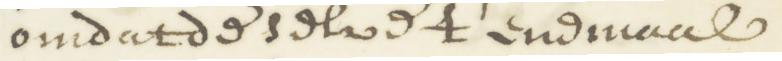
omdat de selve t'enemaal
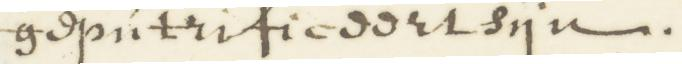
geputrificeert sijn.
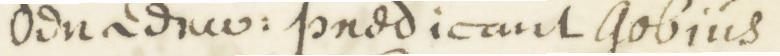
den eerw:e predicant gobius
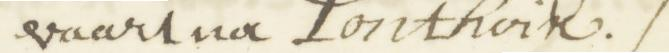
vaart na Lonthoir./
